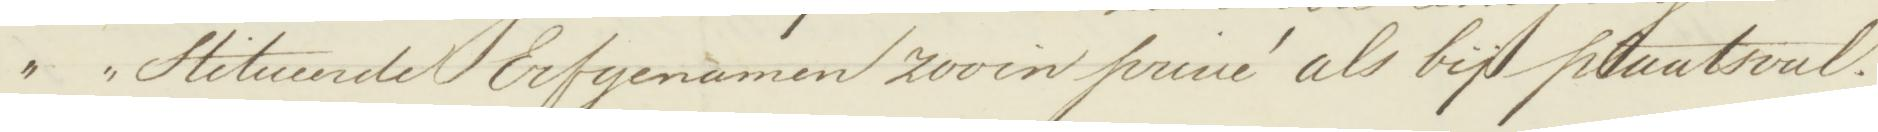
„ „ stitueerde Erfgenamen zoo in privé als bij plaatsvul.
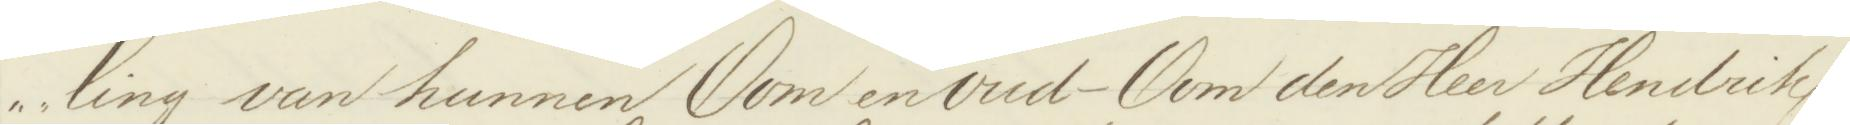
„„ling van hunnen Oom en oud-Oom den Heer Hendrik
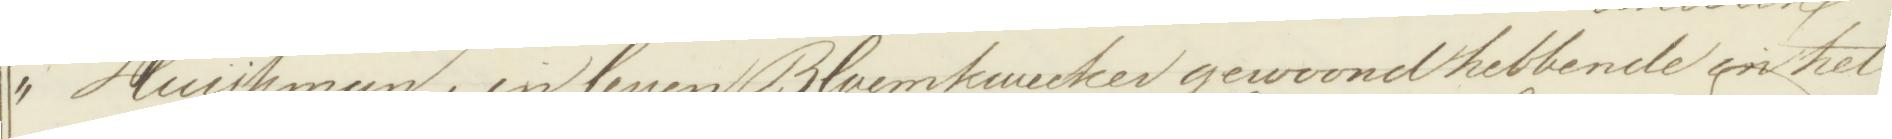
„ Huijkman, in leven Bloemkweeker gewoond hebbende in het
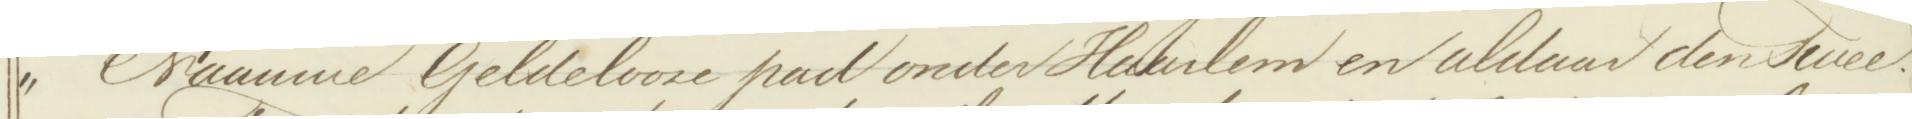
„ Naauwe Geldelooze pad onder Haarlem en aldaar den Twee
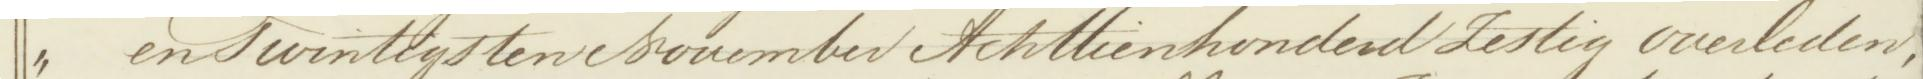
„ enTwintigsten November Achttienhonderd Zestig overleden,
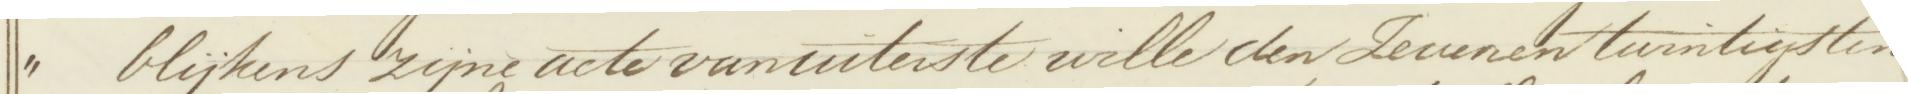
„ blijkens zijne acte vanuiterste wille den Zevenen twintigsten
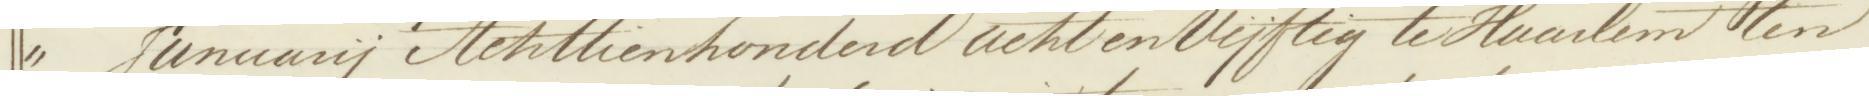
„ Januarij Achttienhonderd acht enVijftig te Haarlem ten
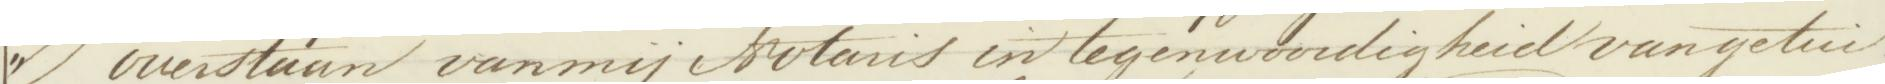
„ overstaan vanmij Notaris in tegenwoordigheid van getui
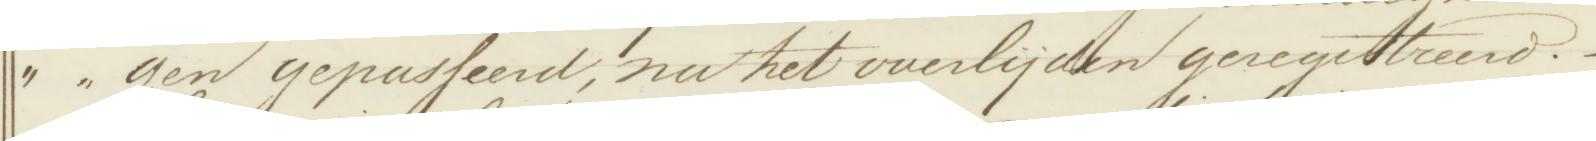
„ „ gen gepasseerd, na het overlijden geregistreerd.
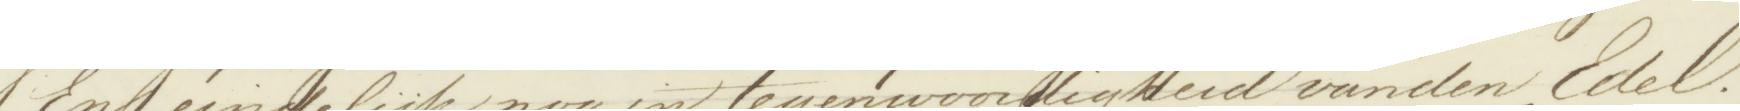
En eindelijk nog in tegenwoordigheid vanden Edel.
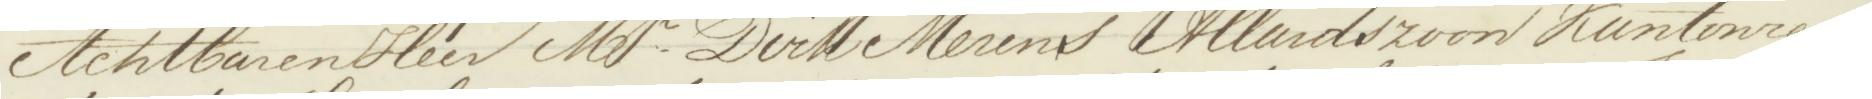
Achtbaren Heer M:r Dirk Merens Allardszoon Kantonreg
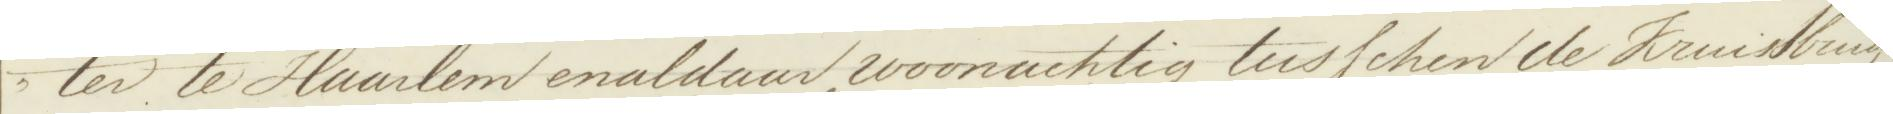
„ter te Haarlem enaldaar woonachtig tusschen de Kruisbrug
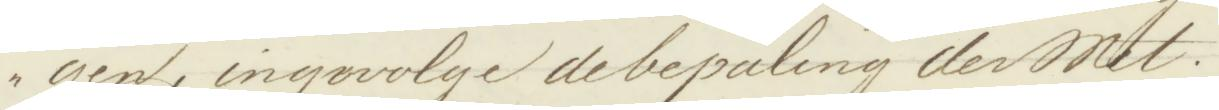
„gen, ingevolge de bepaling der Wet.
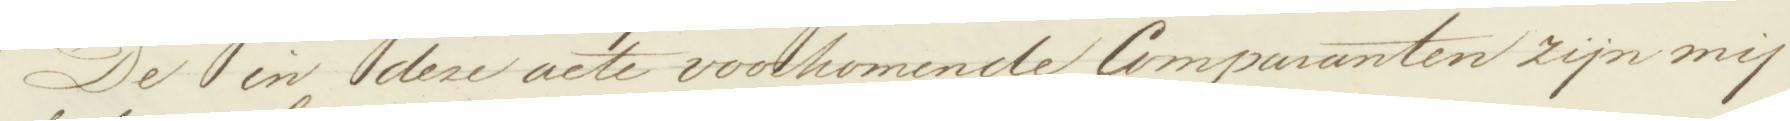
De in deze acte voorkomende Comparanten zijn mij
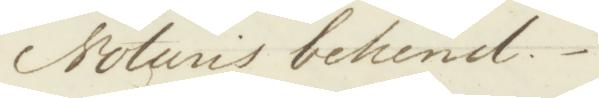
Notaris bekend.-
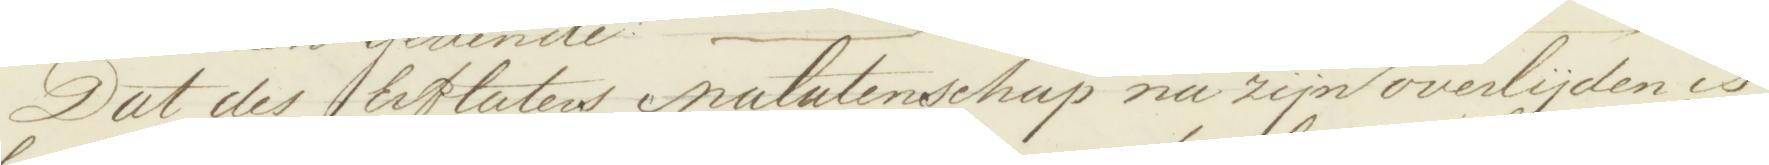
Dat des Erflaters nalatenschap na zijn overlijden is
